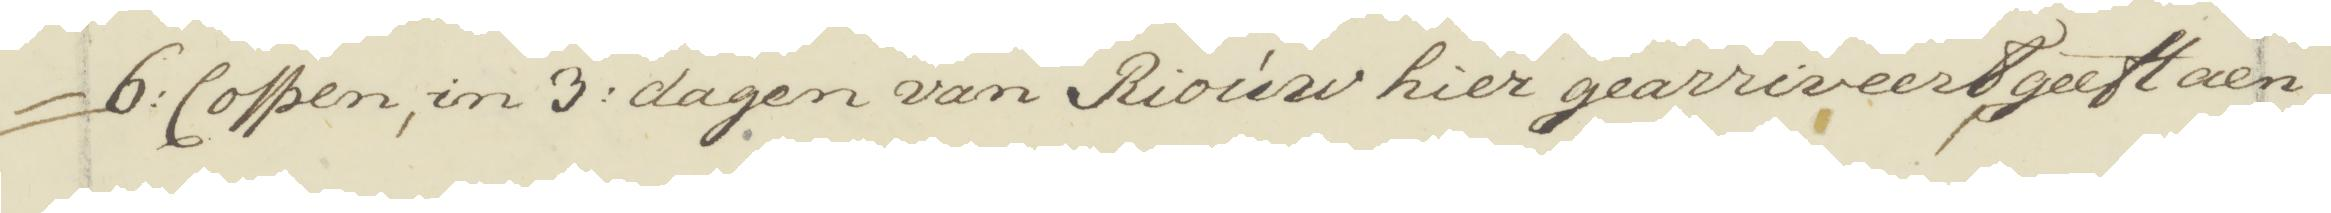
=6: Coppen, in 3: dagen van Riouw hier gearriveert, geeft aen.
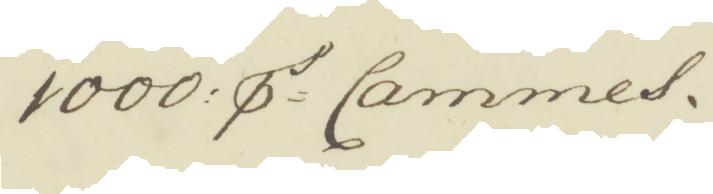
1000: p=s Cammes.
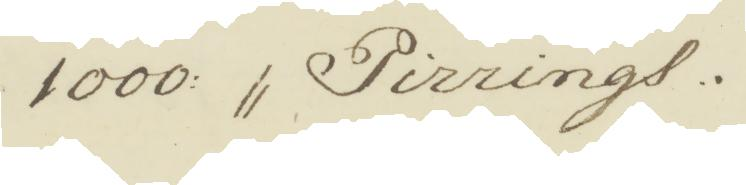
1000: „ Pirrings.
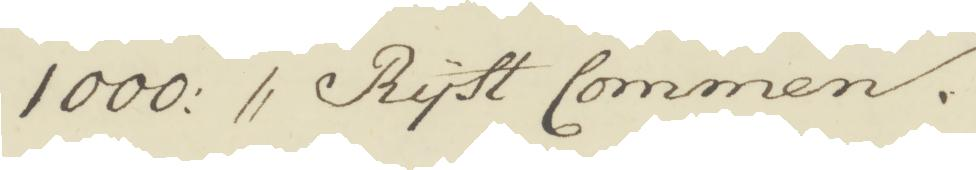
1000: „ Rijst Commen.
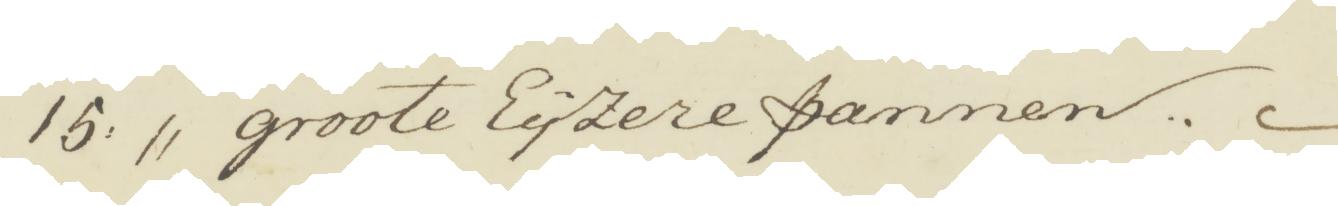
15: „ groote Eijzere pannen..
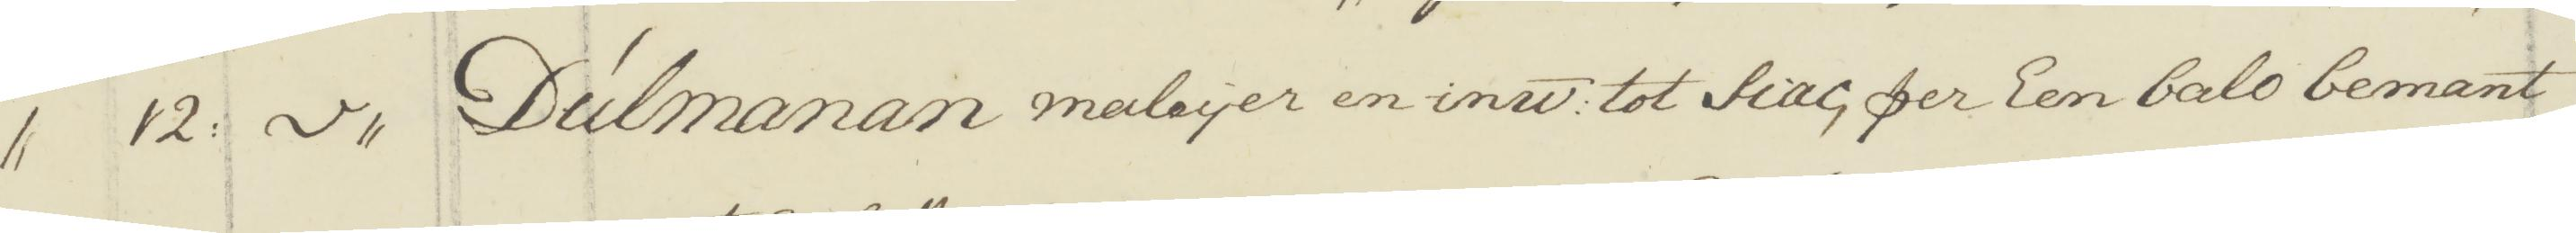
„ 12: d„ Dulmanan maleijer en inw: tot siac, per Een balo bemant
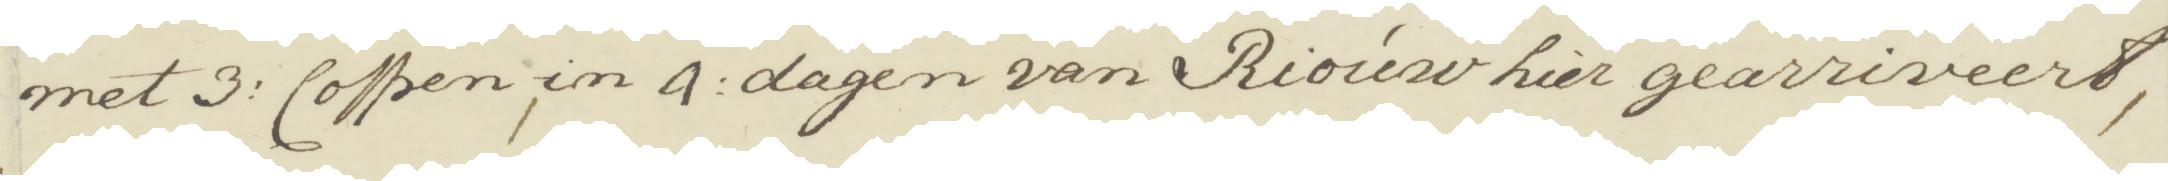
met 3: Coppen, in 4: dagen van Riouw hier gearriveert,
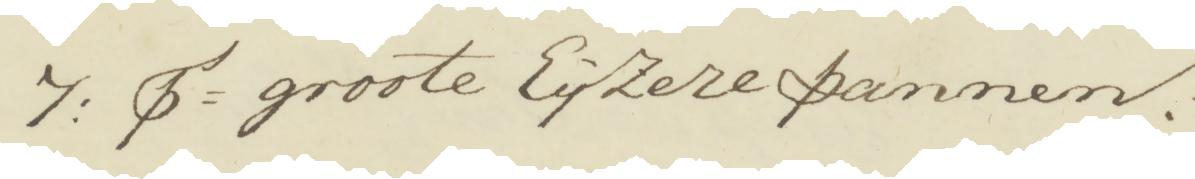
7: p=s groote Eijzere pannen.
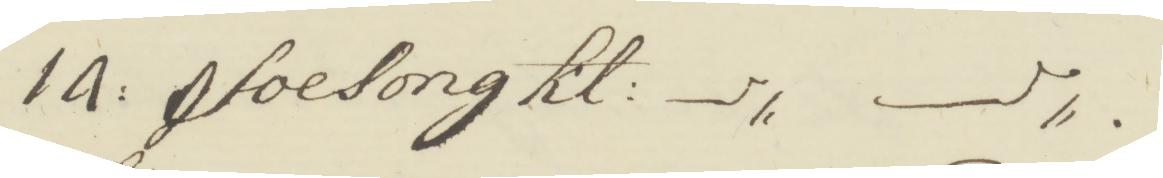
14: foesong kl: _„o _„o.
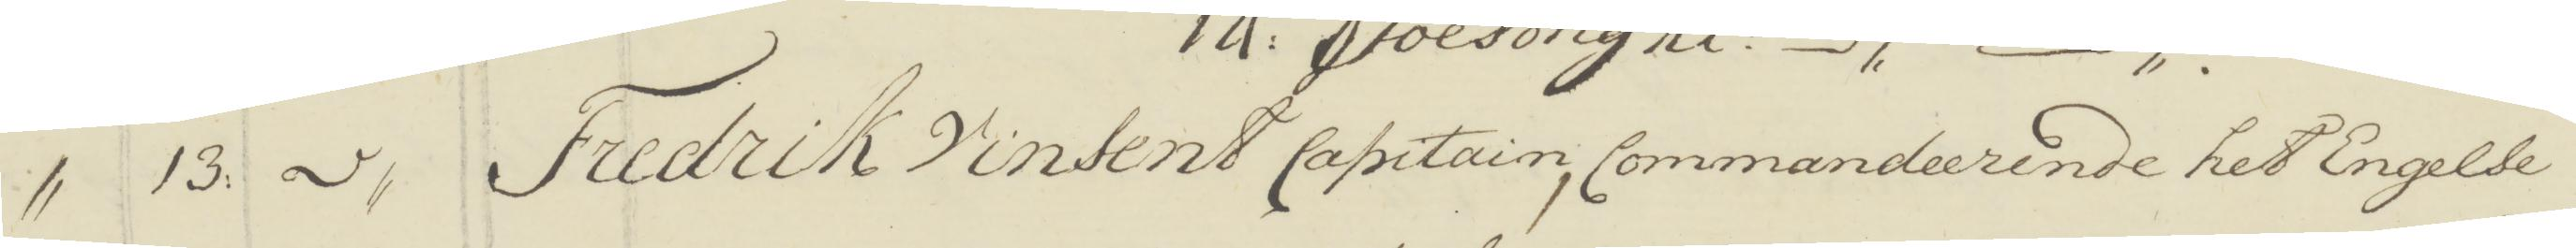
„ 13: d„ Fredrik Vinsent Capitain, Commandeerende het Engelse
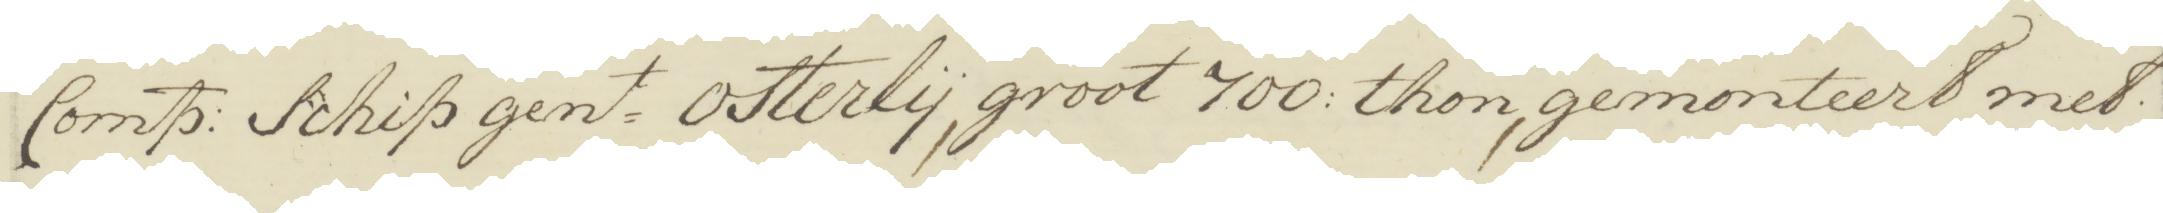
Comp: schip gen=t osterlij, groot 700: thon, gemonteert met.
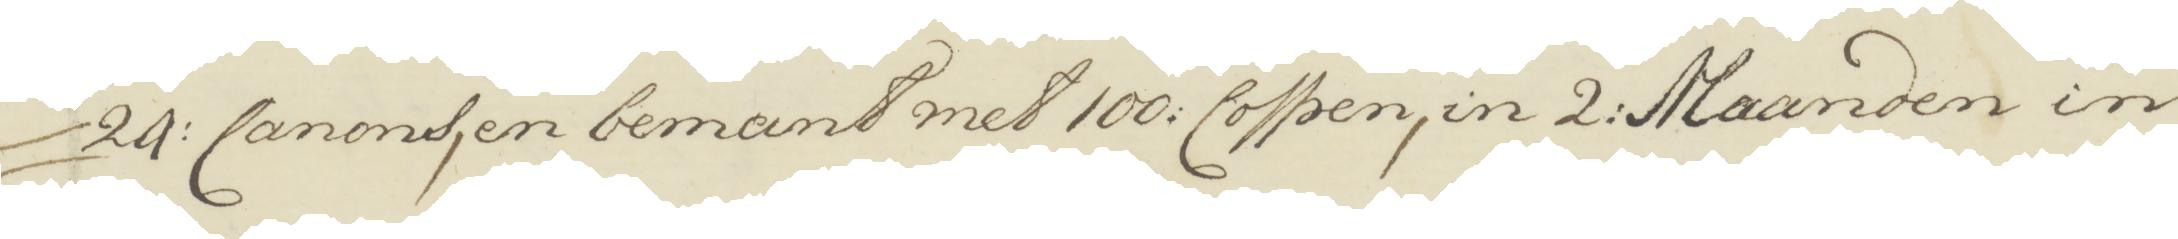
=24: Canons, en bemant met 100: Coppen, in 2: Maanden in
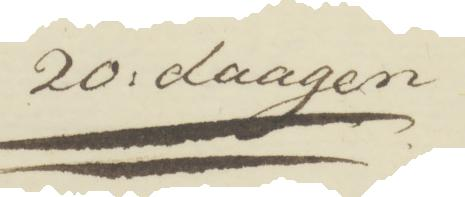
20: daagen
